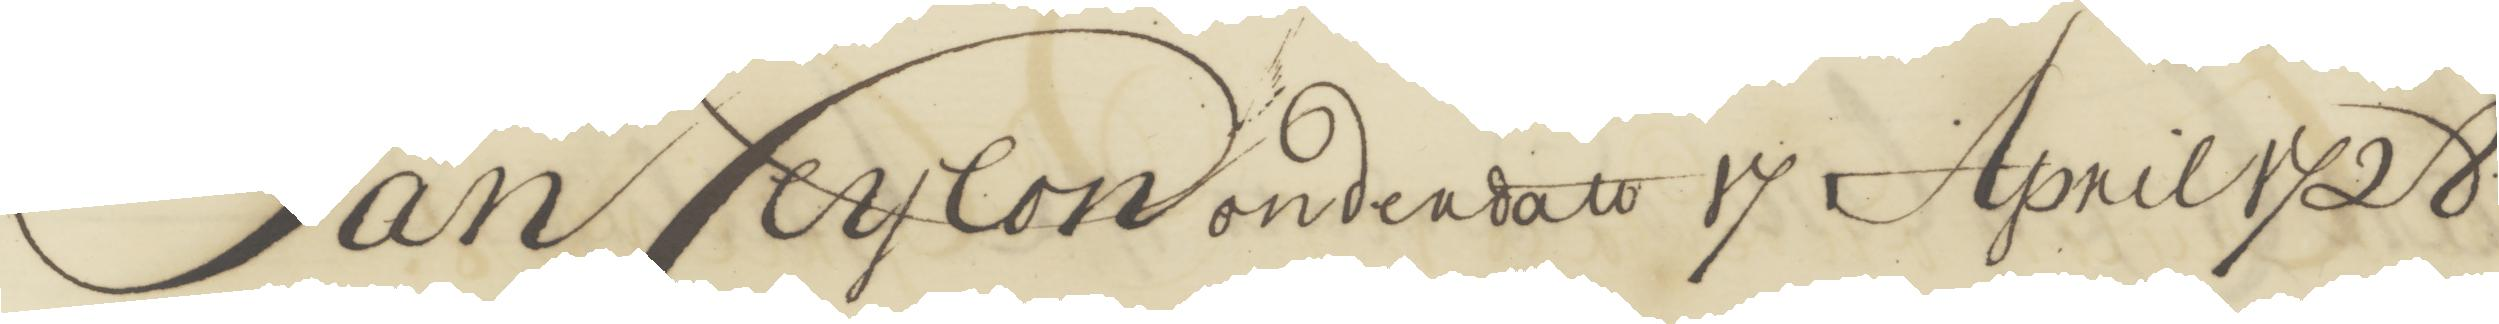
Van Ceylon onder dato 17 April 1728:
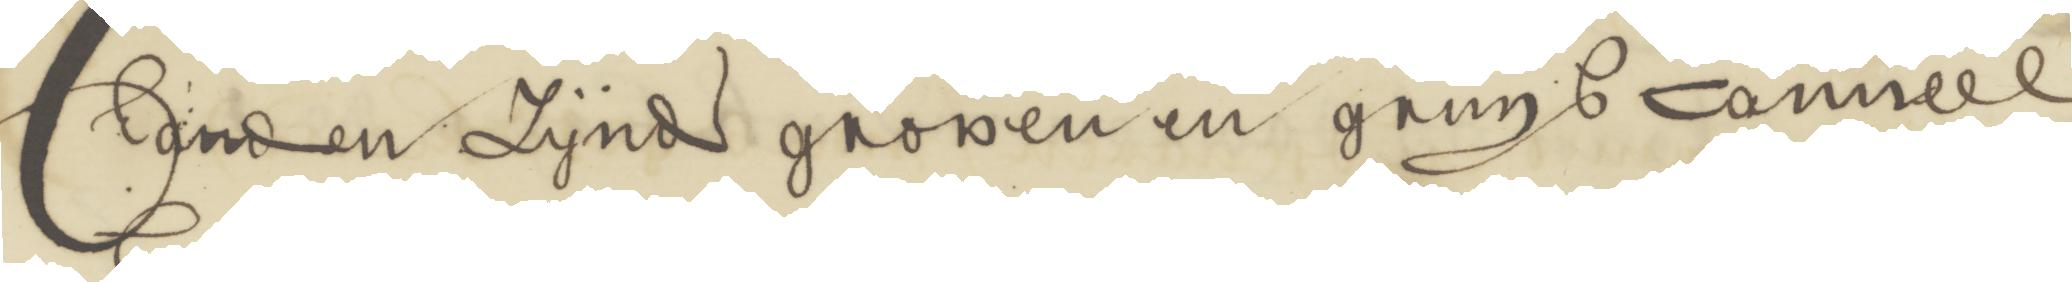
handen zijnde groven en gruijs canneel
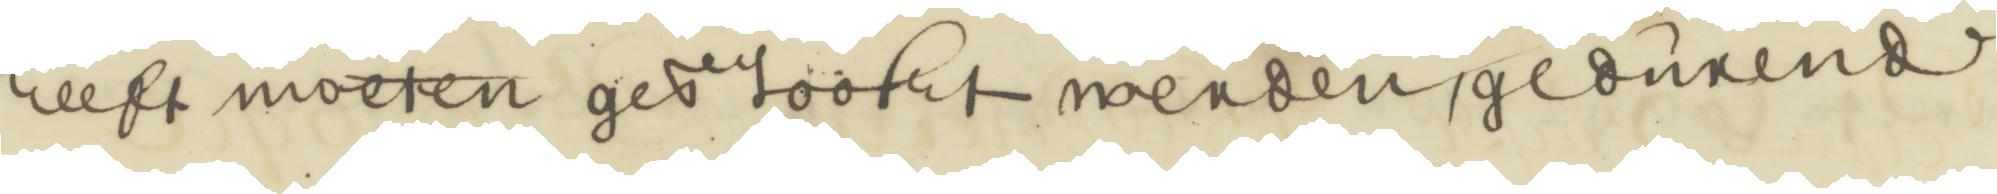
heeft moeten gestookt werden, gedurende
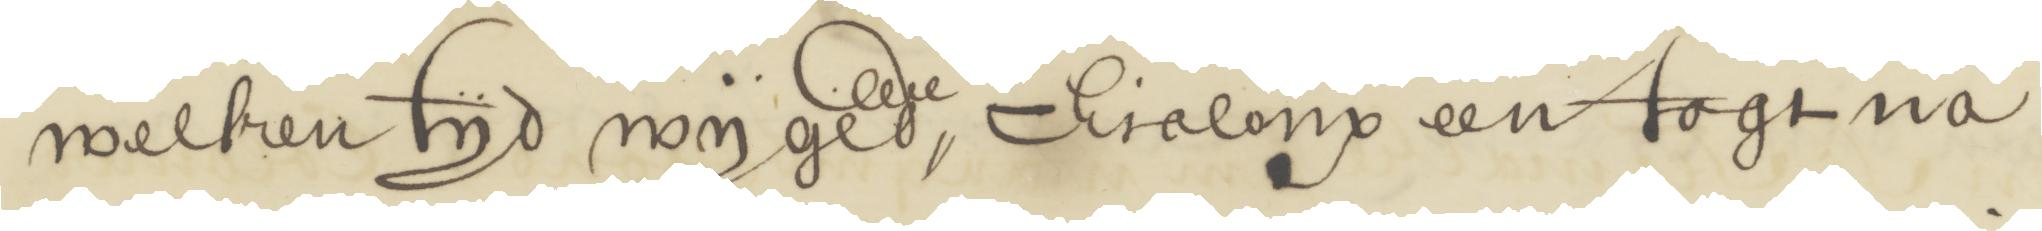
welken tijd wij ged„e chialoup een togt na
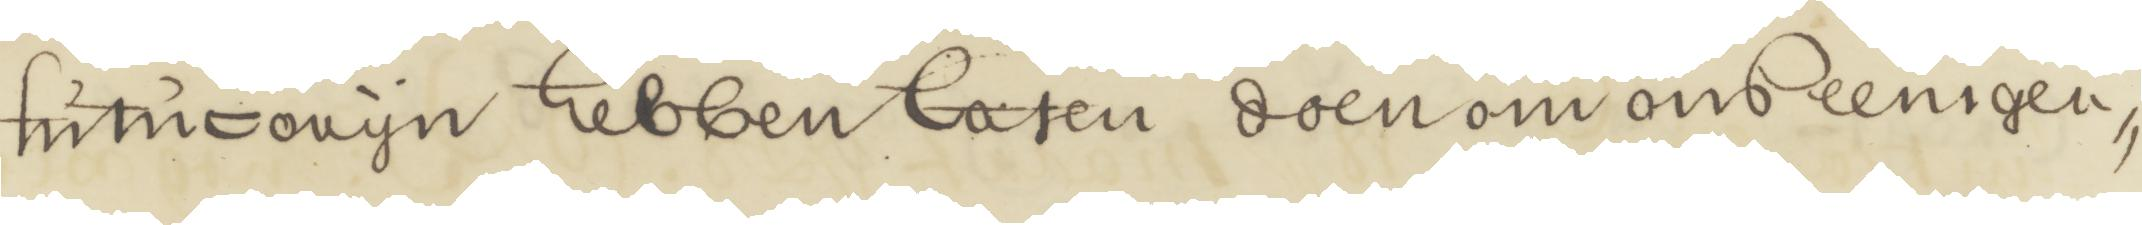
tutucorijn hebben laten doen om ons eeniger„
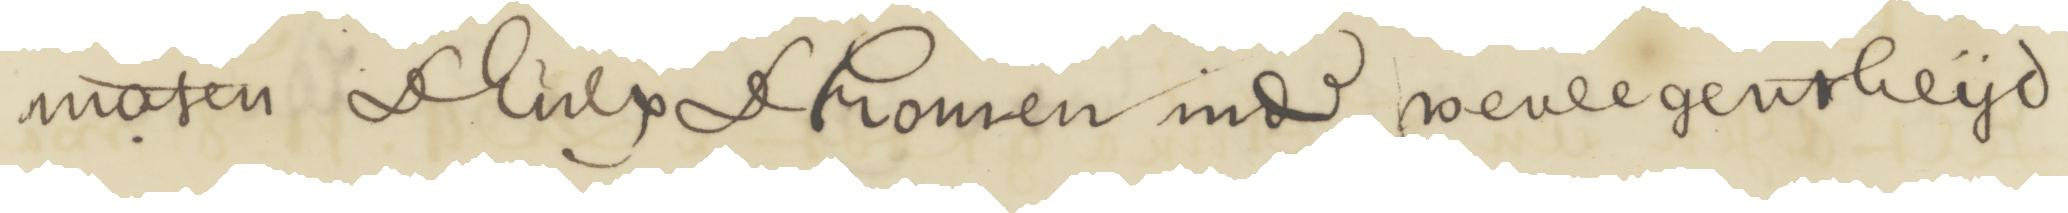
maten tehulp te komen inde verlegentheijd
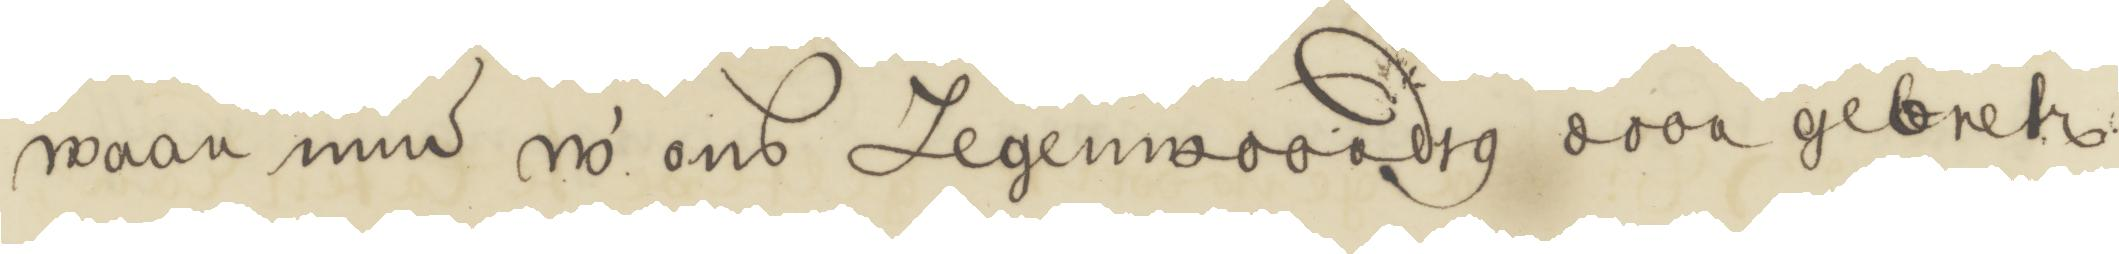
waar inne w' ons Iegenwoordig door gebrek
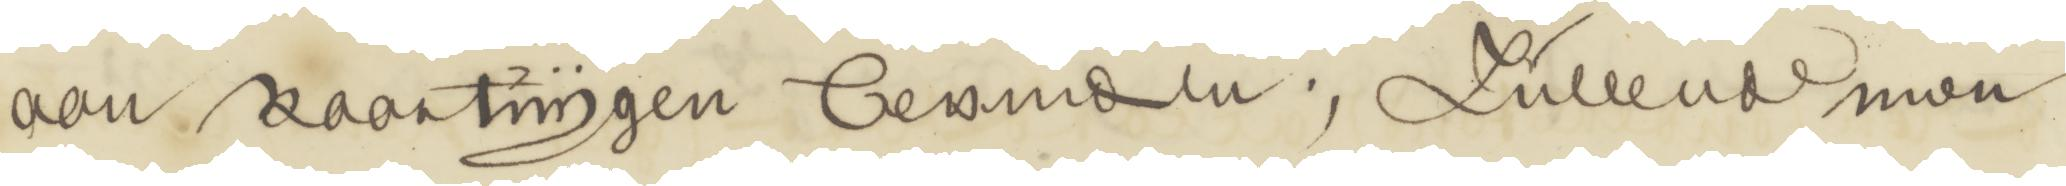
aan vaartuijgen bevinden; zullende men
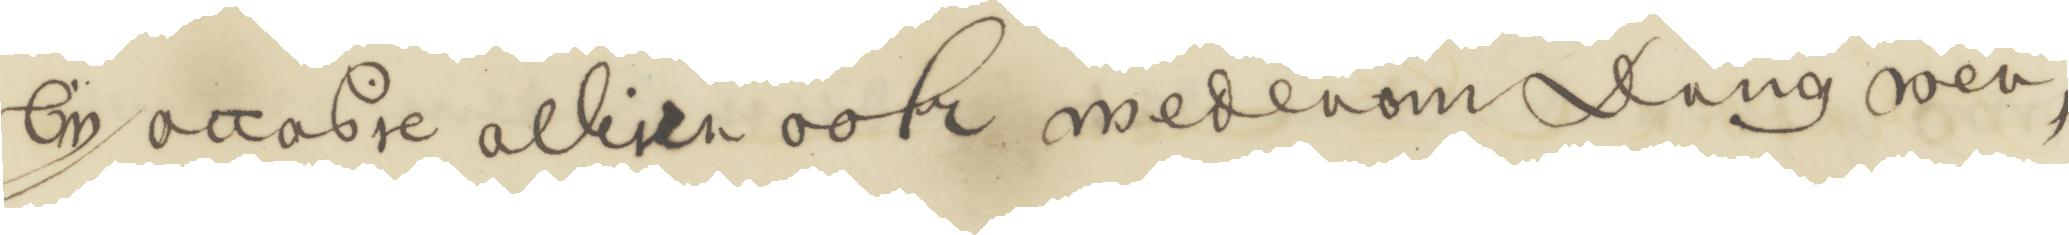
bij occasie alhier ook wederom terug ver„
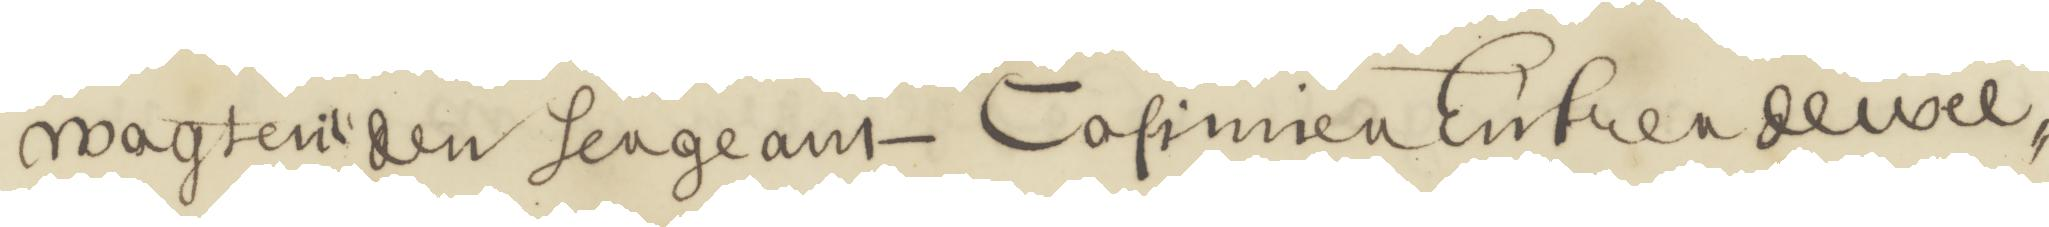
wagten den sergeant Casimier huker dewel„
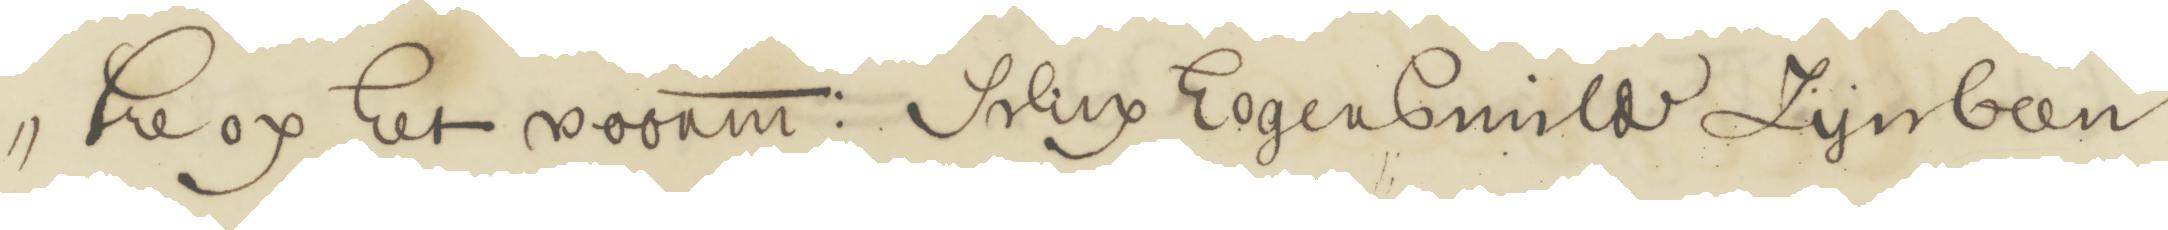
„ ke op het voorm: schip hogersmilde zijn been
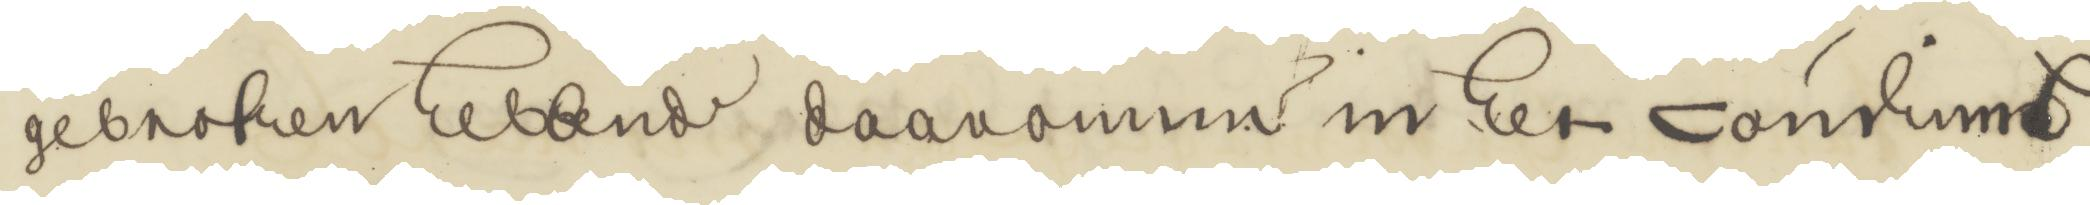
gebroken hebbende daaromme in het couchims
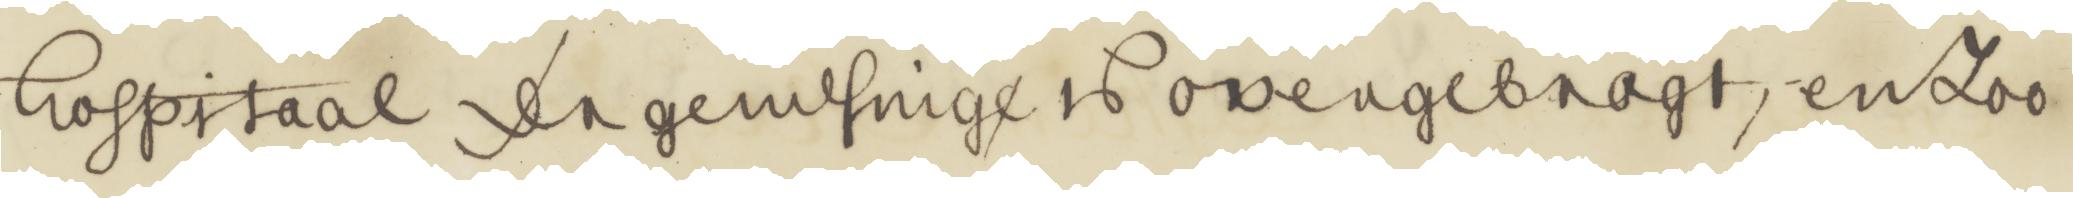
hospitaal ter genesinge is overgebragt, en zoo
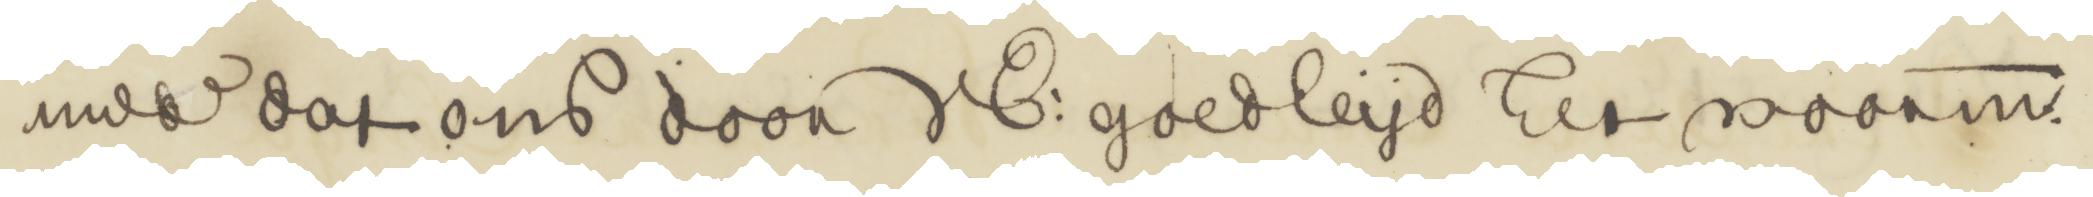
mede dat ons door VE: goedheijd het voorm:
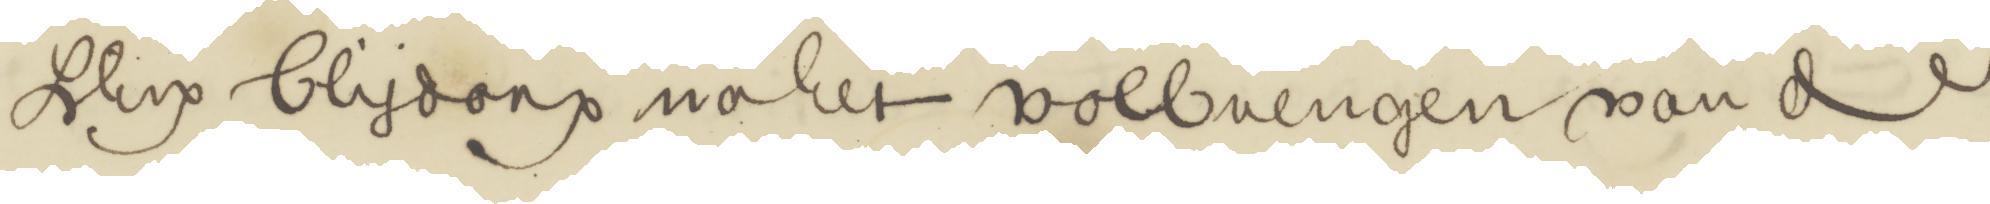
schip blijdorp na het volbrengen van de
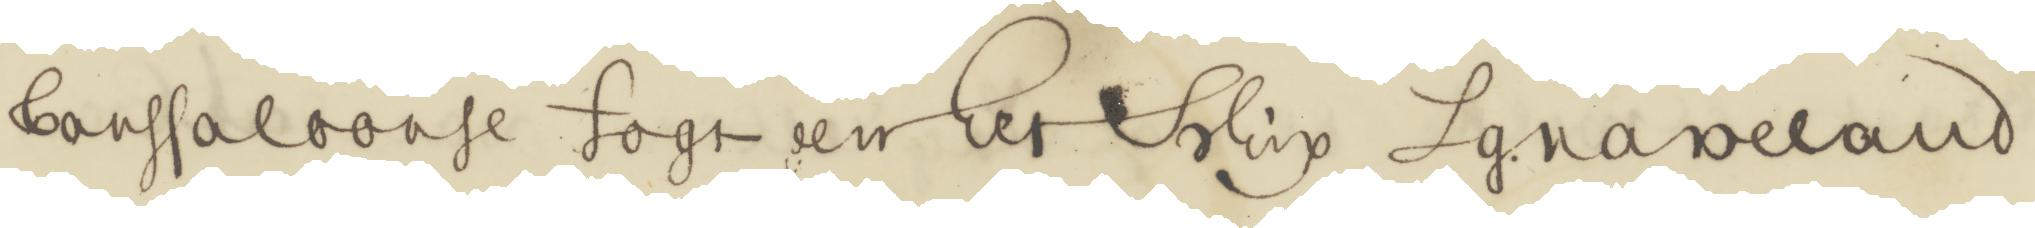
barssaloorse togt eer het schip sgraveland
